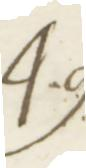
4.9:
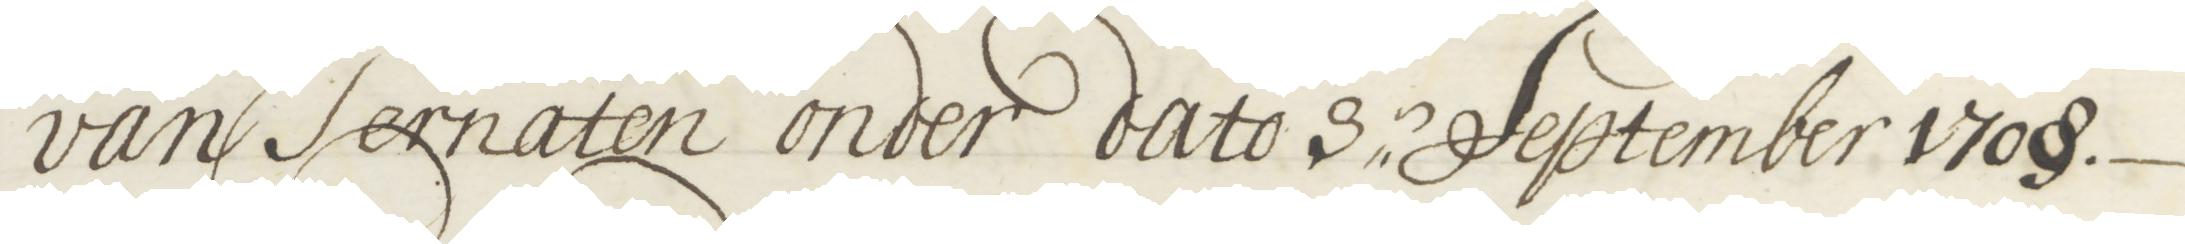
van Ternaten onder dato 3„en September 1708.—
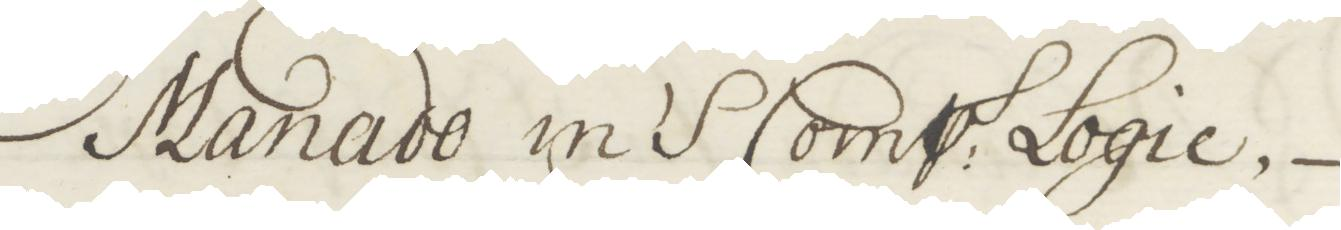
Manado in ’s Comp:s Logie,—
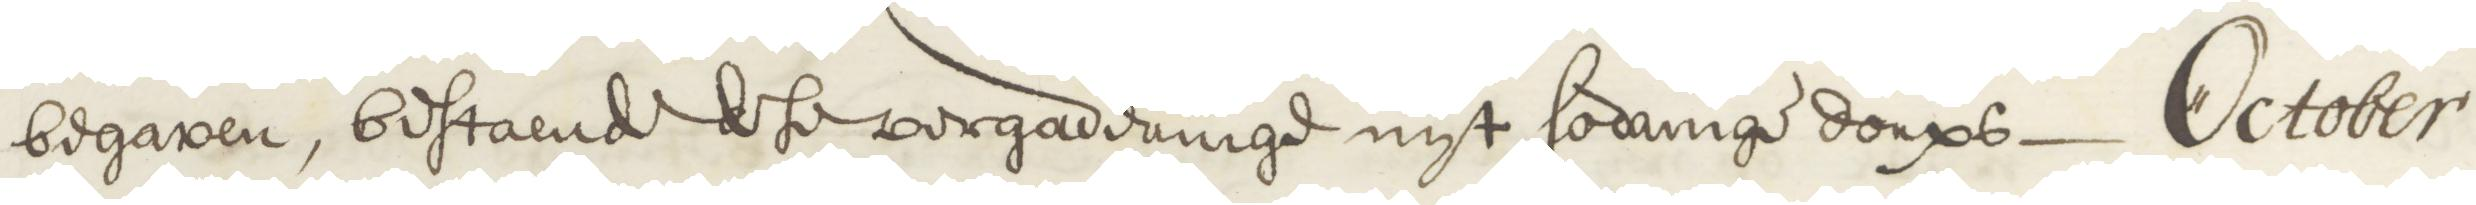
begaven, bestaende dese vergaderinge uijt sodanige dorps — October
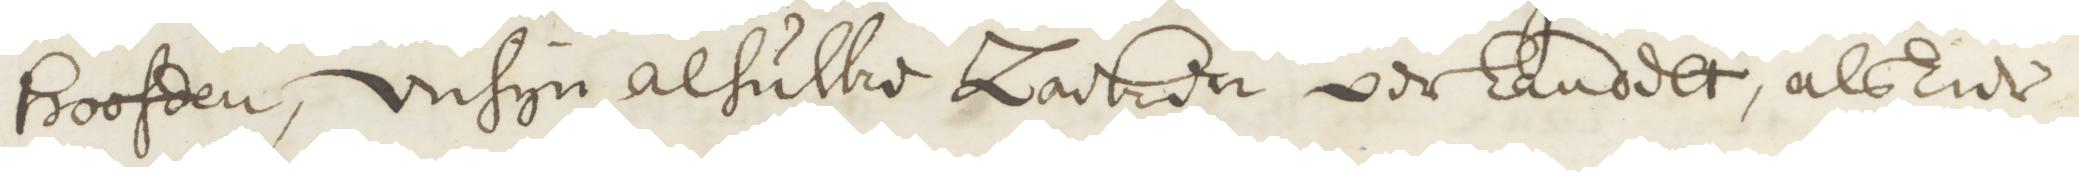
hoofden, en sijn alsulke zaeken verhandelt, als hier
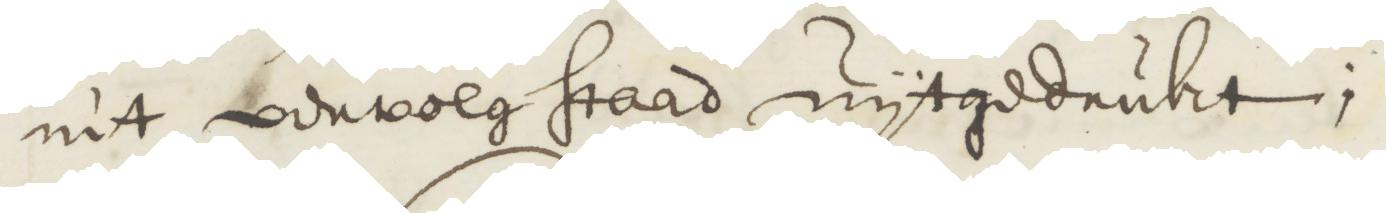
in't vervolg staad uijtgedrukt;
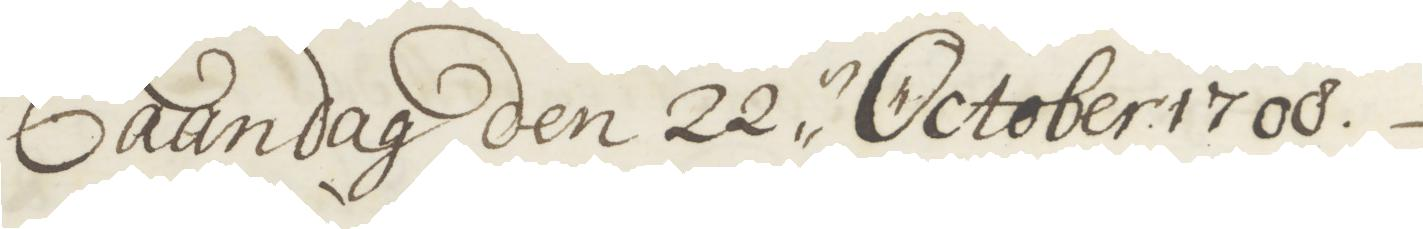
Maandag den 22„en October 1708.—
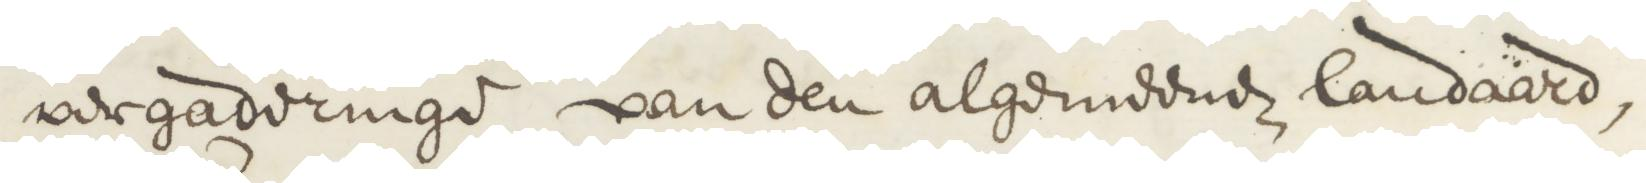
vergaderinge van den algemeenen landaard,
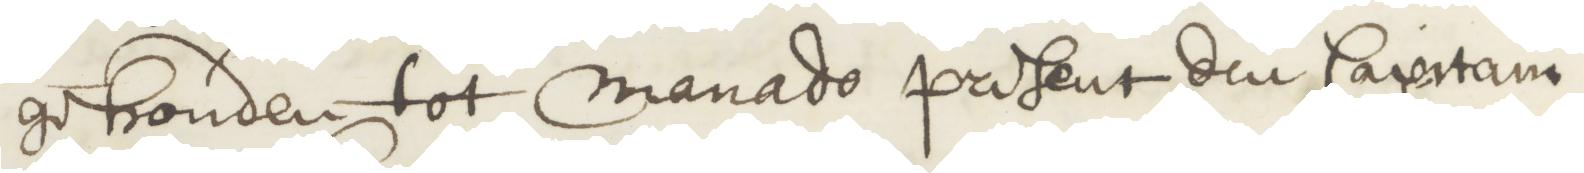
gehouden tot manado present den Capitain
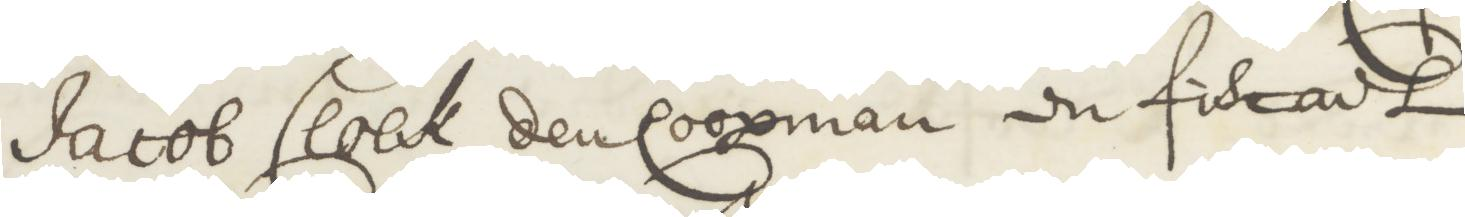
Iacob Cloek den Coopman en fiscael
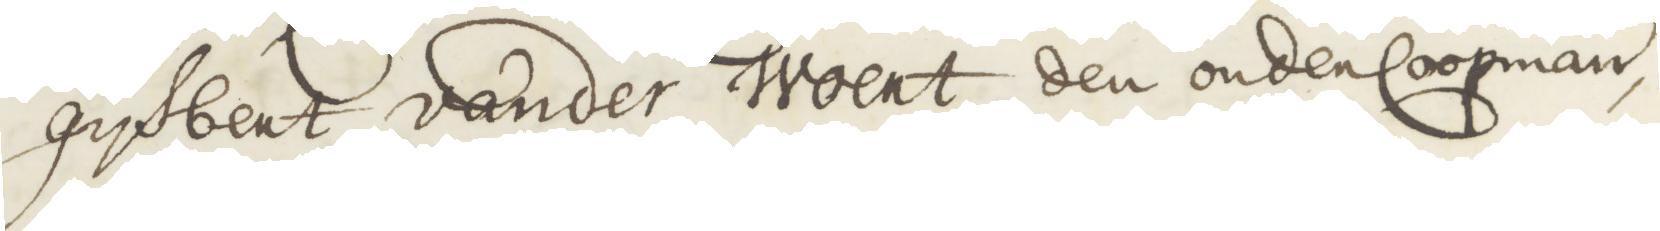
gijsbert van der Woert den onder coopman,
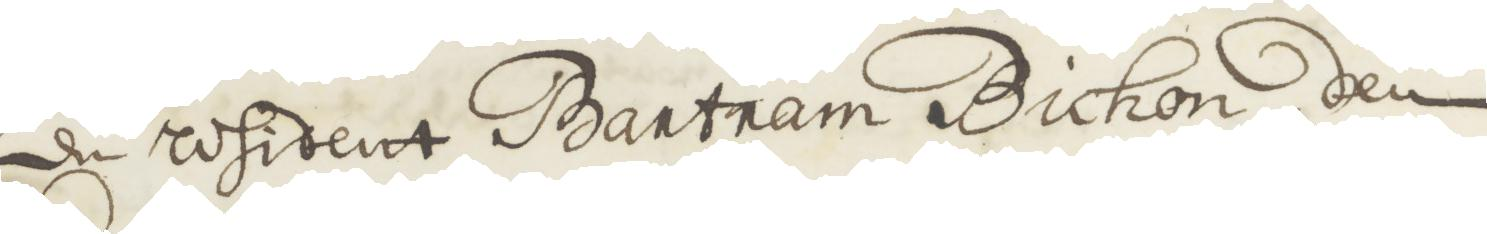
en resident Bartram Bichon, den
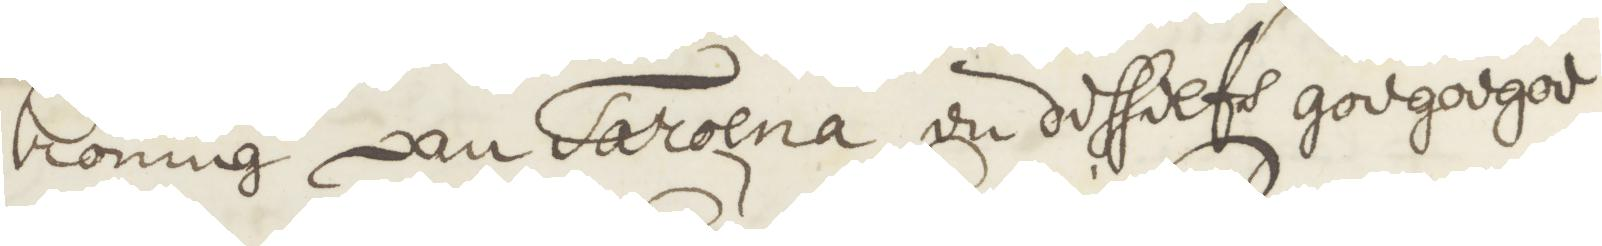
koning van Taroena en desselfs goegoegoe
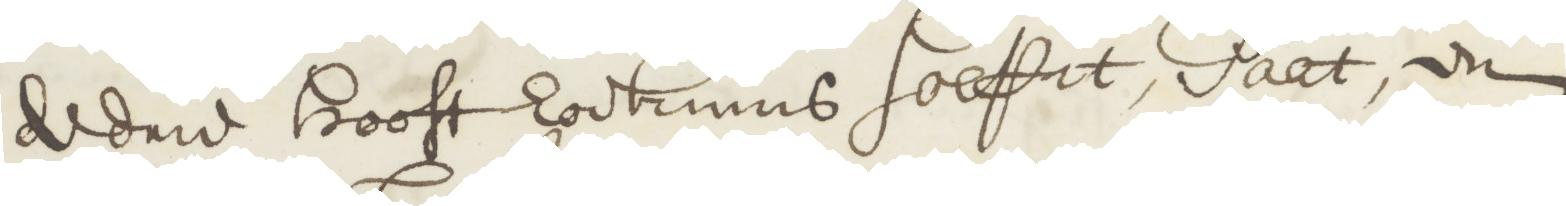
de drie hooft hoekums soeppit, Paat, en
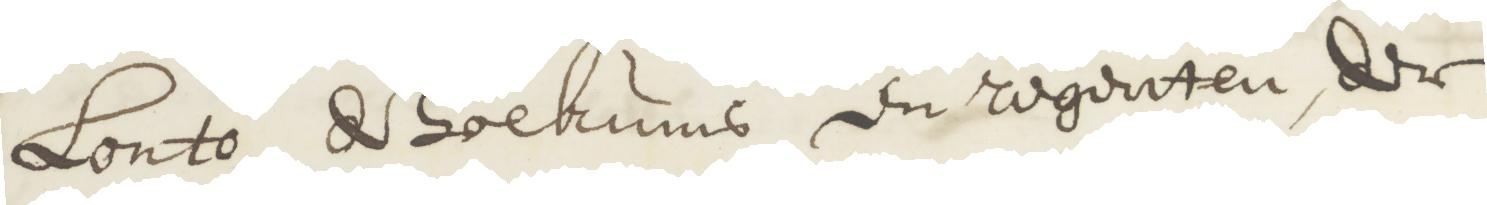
Lonto, de hoekums en regenten, der
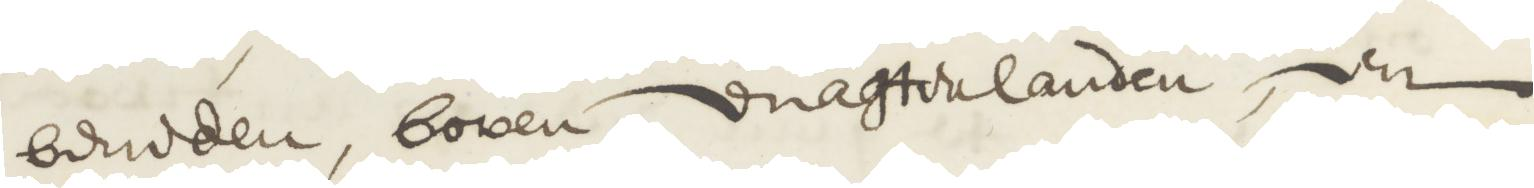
beneden, boven, en agterlanden, en
